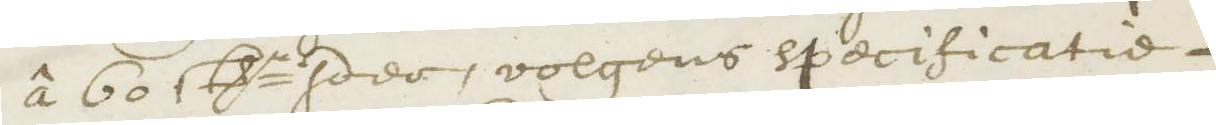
â 60 stver=s jder, volgens specificatie
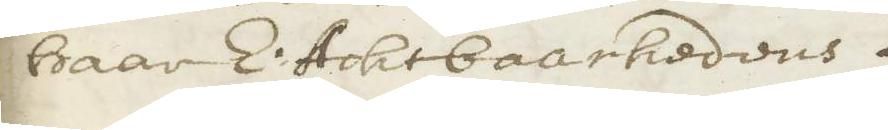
haar E: Achtbaarhedens
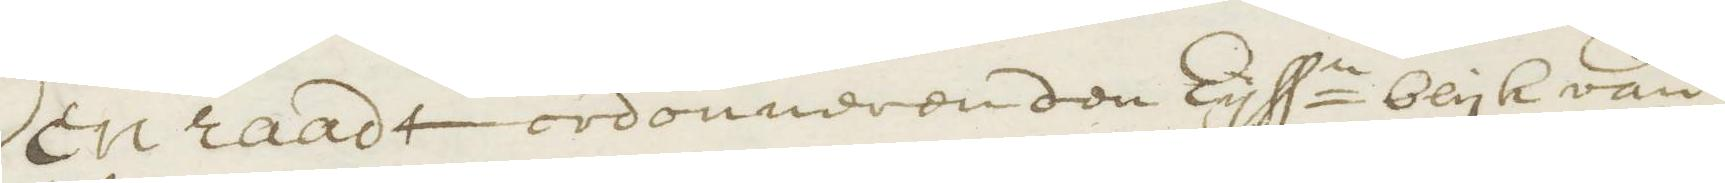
Den raadt ordonneren den Eijss=r blijk van
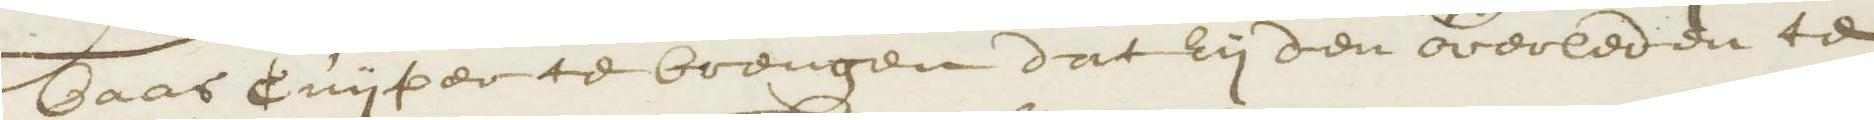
baas cuijper te brengen dat hij den overleden te
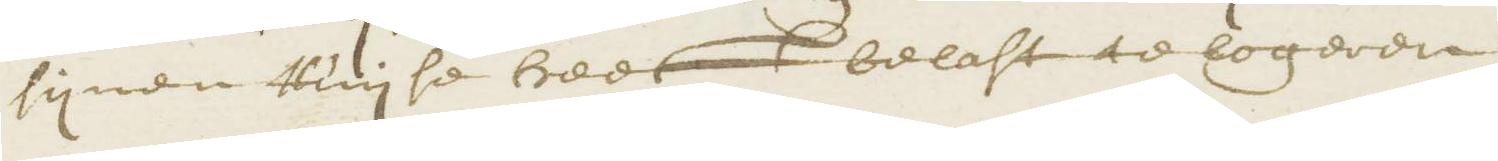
sijnen Huijse heeft belast te logeren
